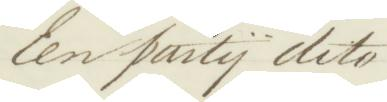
Een partij dito
